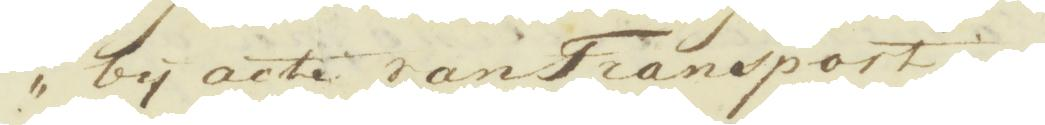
„ bij acte van Transport in
